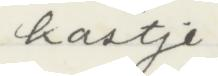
kastje
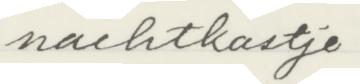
nachtkastje
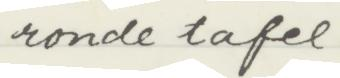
ronde tafel
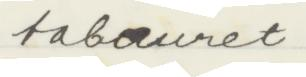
tabouret
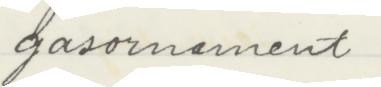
gasornament
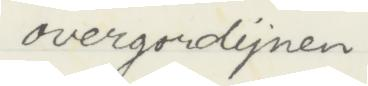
overgordijnen
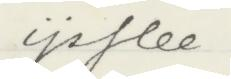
ijslee
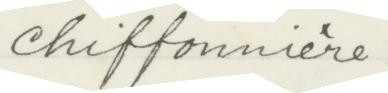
chiffonnière
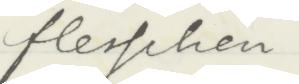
flesschen
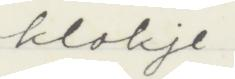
klokje
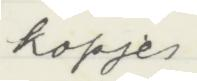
kopjes
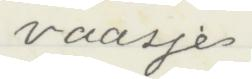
vaasjes
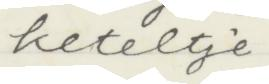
keteltje
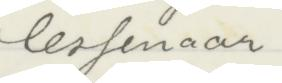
lessenaar
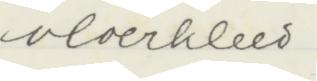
vloerkleed
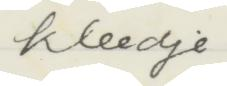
kleedje
